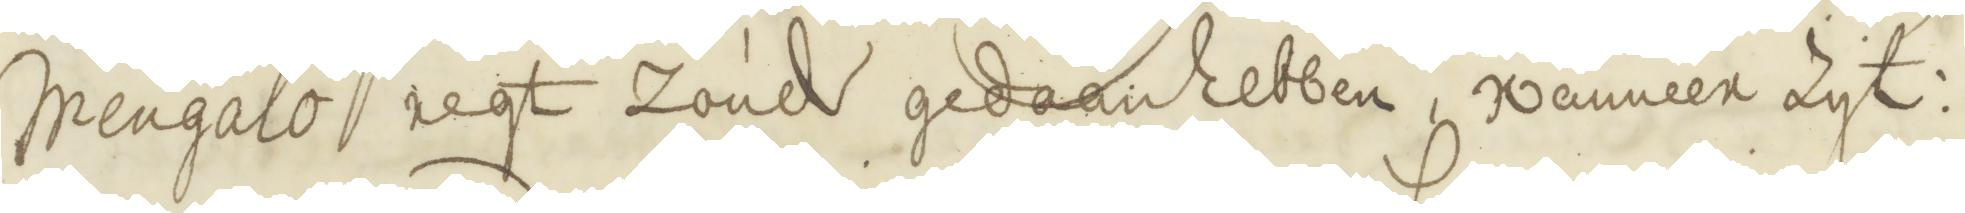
Mengalo regt zoude gedaan hebben, wanneer zijt:
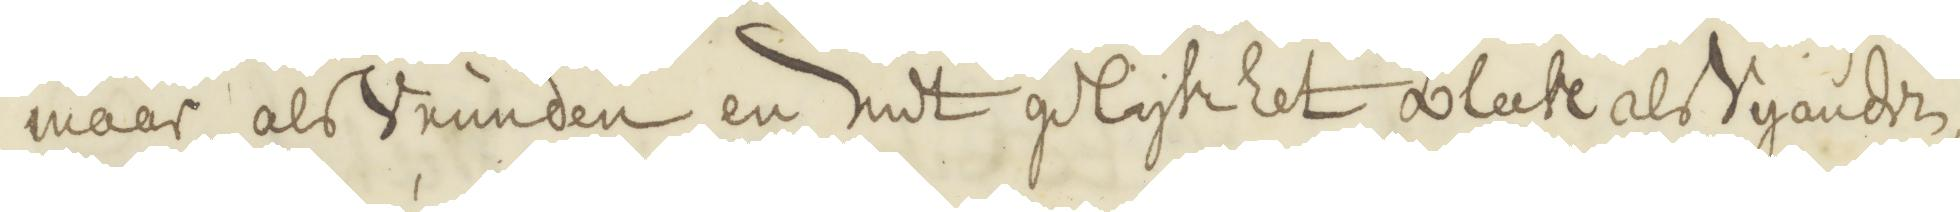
maar als vrunden en met gelijk het Bleek als vijanden,
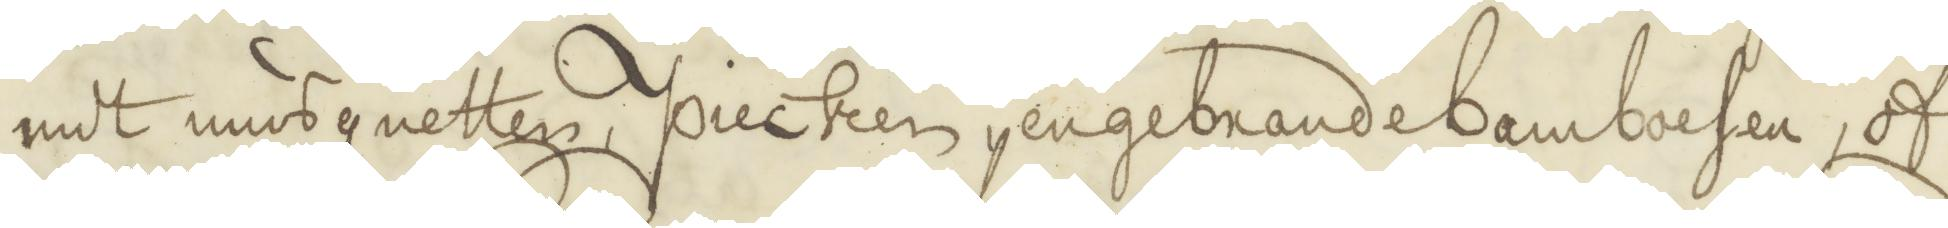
met musquetten, piecken, engebrande bamboesen, of
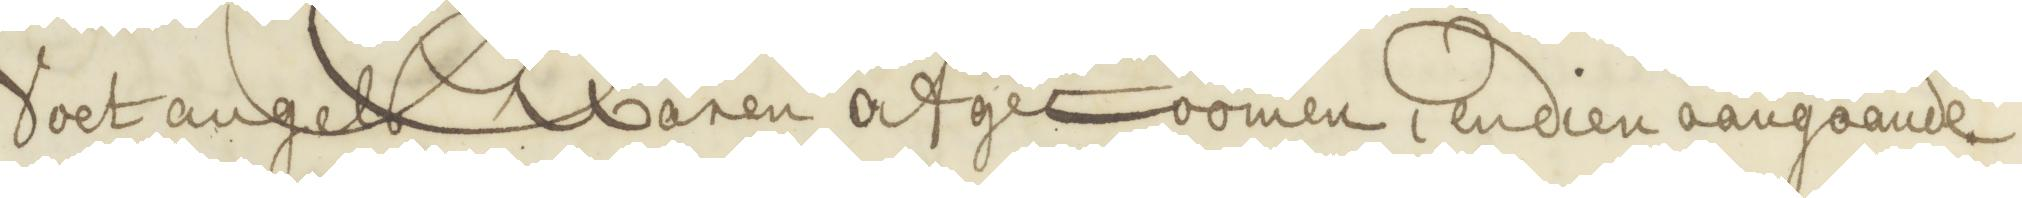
voet angels waren afgecoomen, en dien aangaande
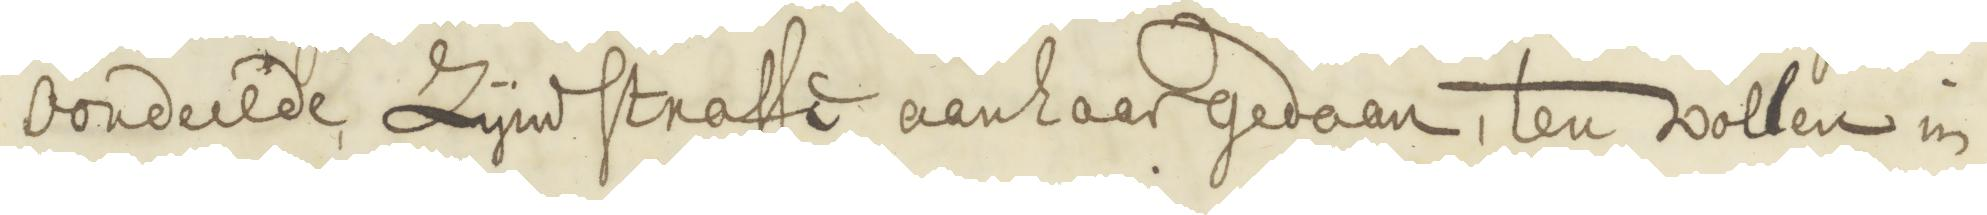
oordeelde, zijne straffe aan haar gedaan, ten vollen in
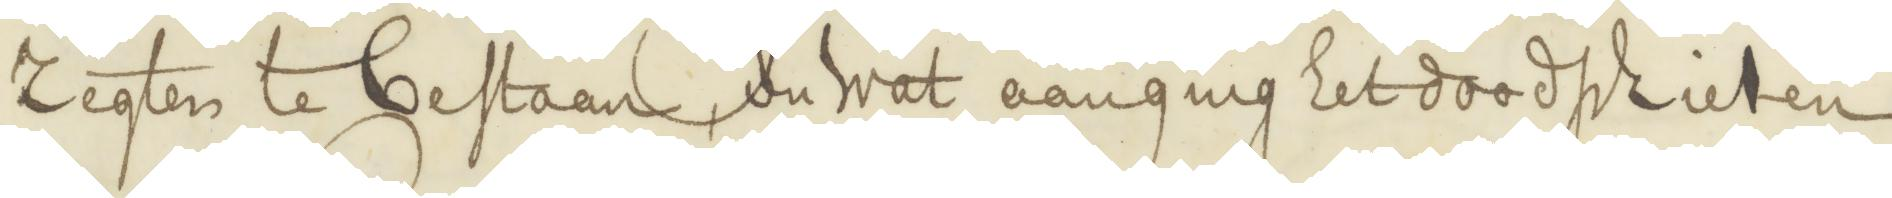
regten te bestaan, En wat aanging het doodschieten
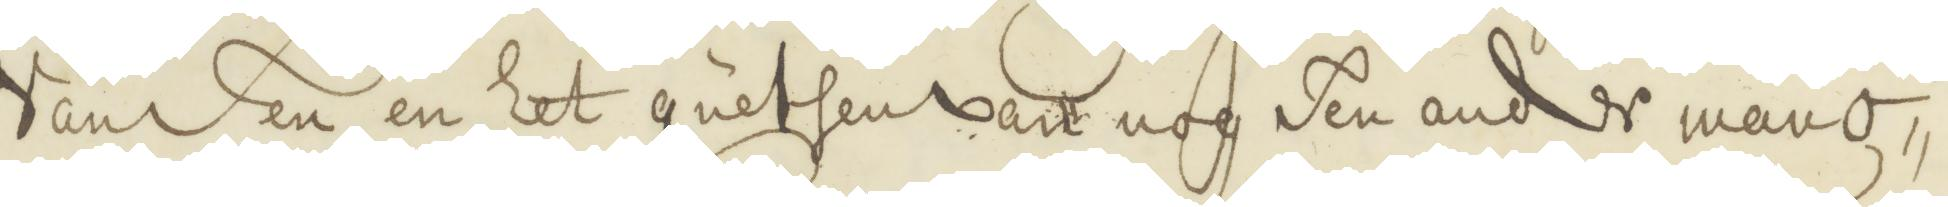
van Een, en het quetsen van nog Een ander waro„
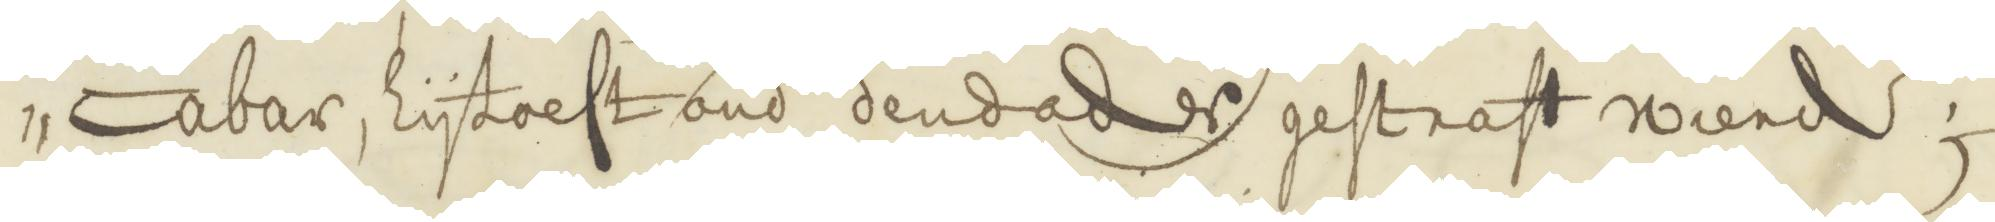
„Cabar, hij toestond den dader gestraft wierde:
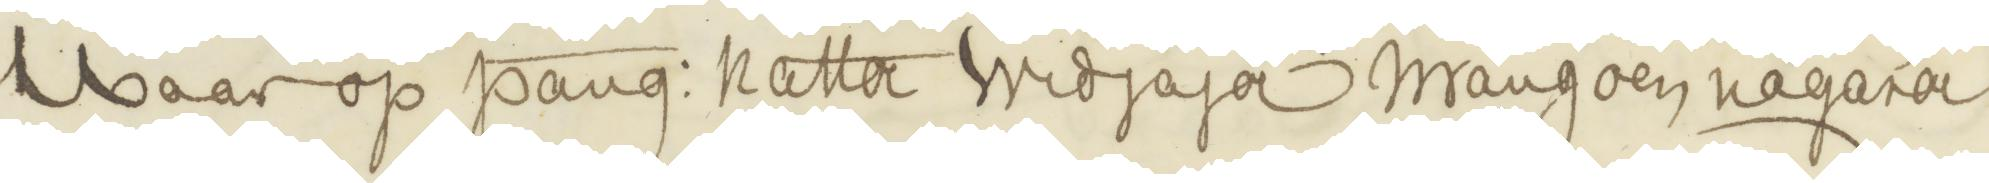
Waar op pang: Natter Widjaja mangoen nagara
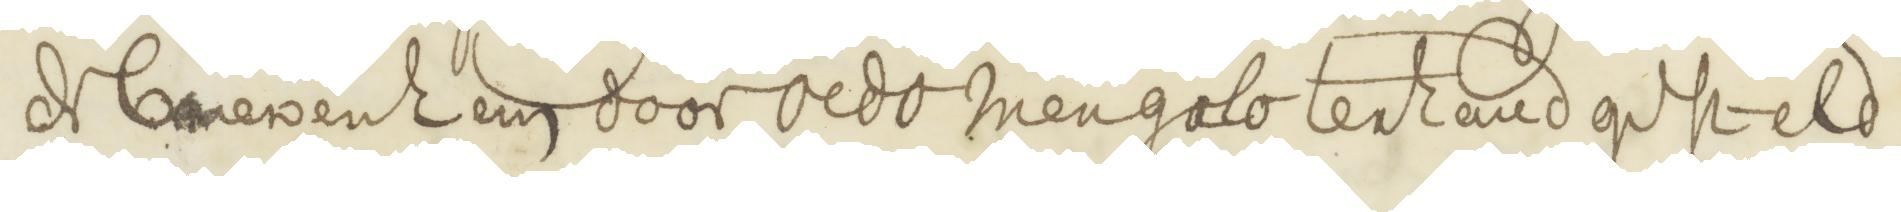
de brieven hem door oedo mengolo terhand gesteld
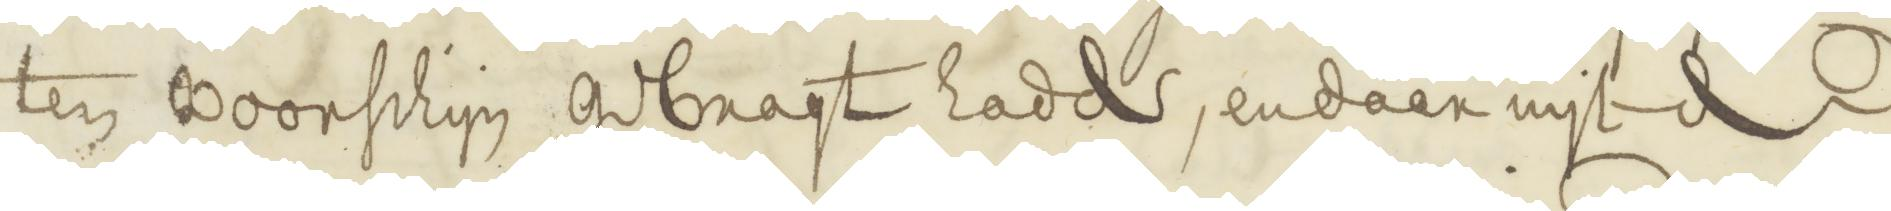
ten voorschijn gebragt hadde, en daar uijt de
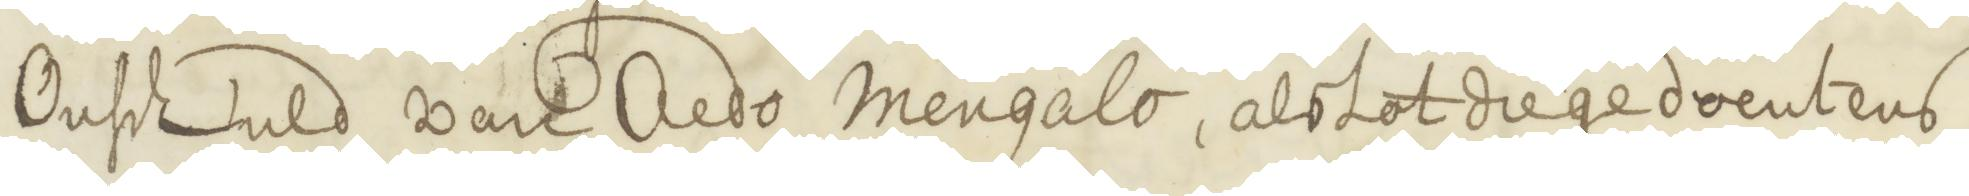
Onschuld van Oedo Mengalo, als tot die gedoentens
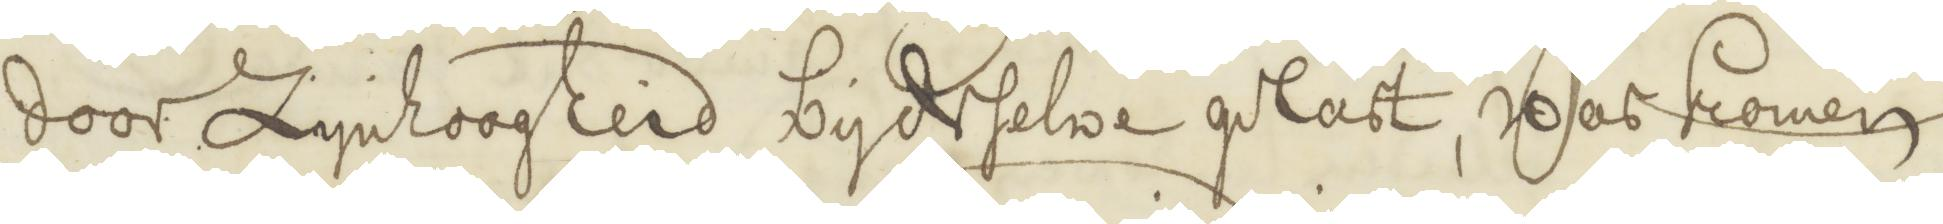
door zijn hoogheid bij deselve gelast, was komen
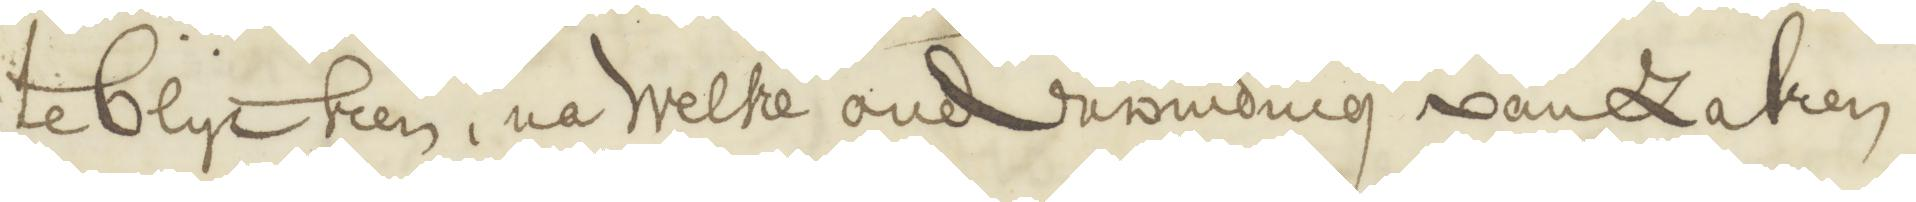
te blijcken, na welke ondervinding van zaken
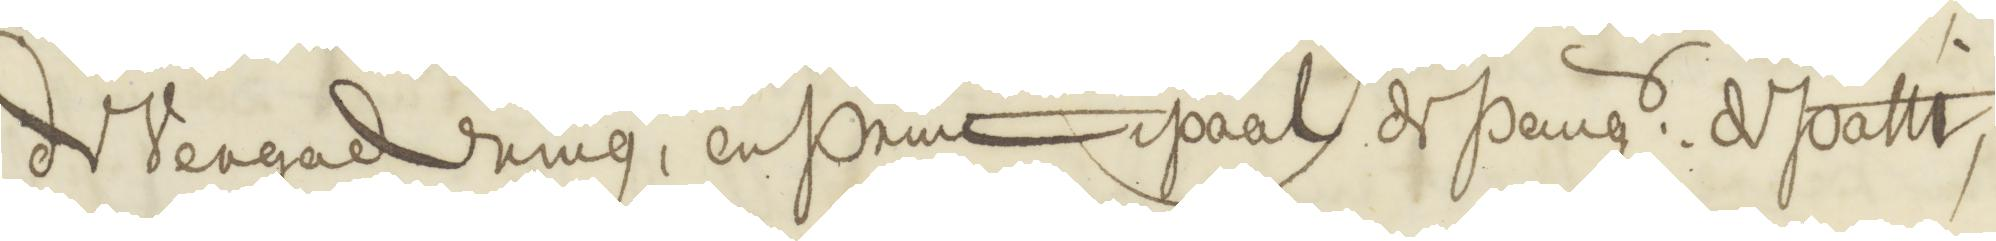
de Vergadering, en Principaal de pang:s de patti,
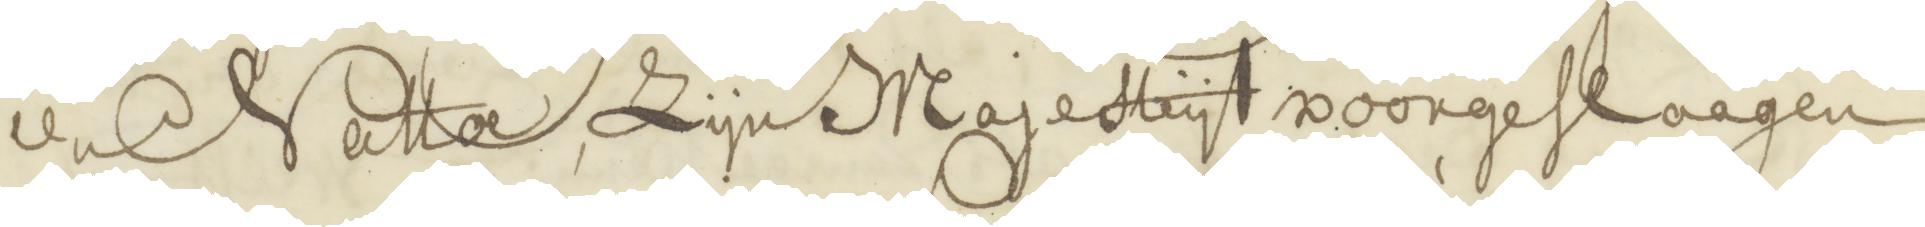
en Natta, zijn Majesteijt voorgeslaagen
